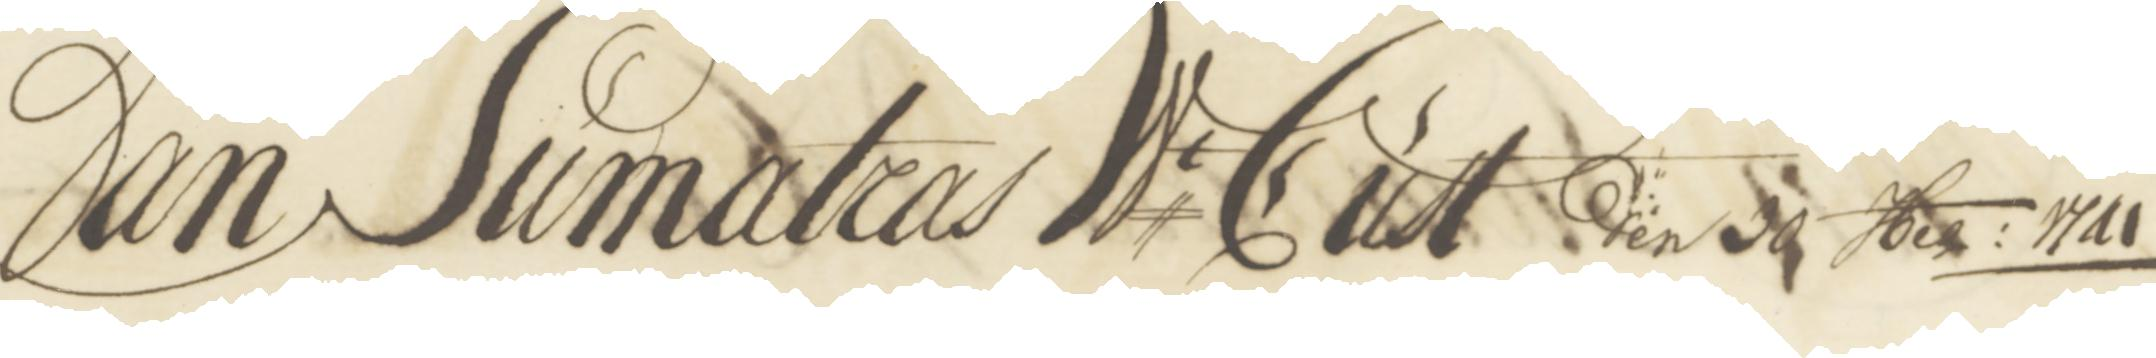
Van Sumatras W„t Cust den 30 7ber: 1741
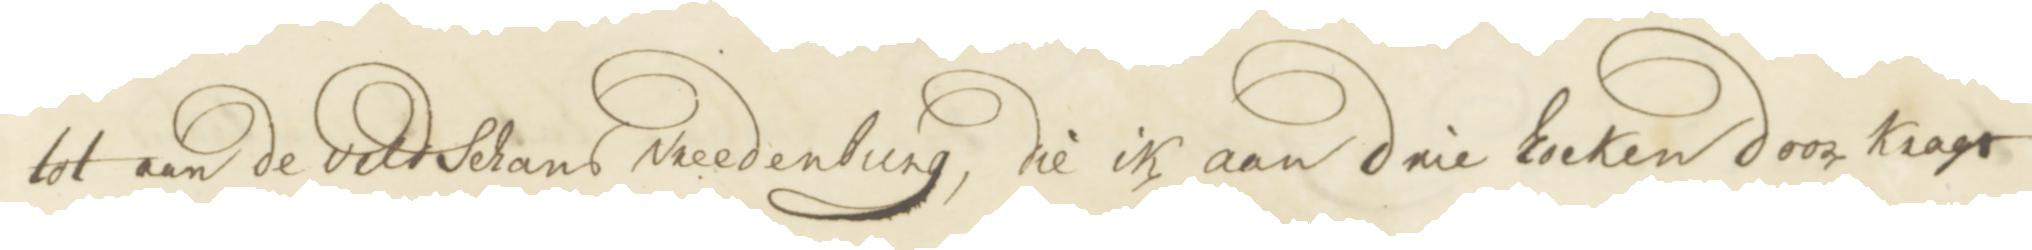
tot aen de veldschans vreedenburg, die ik aan drie hoeken door kragt
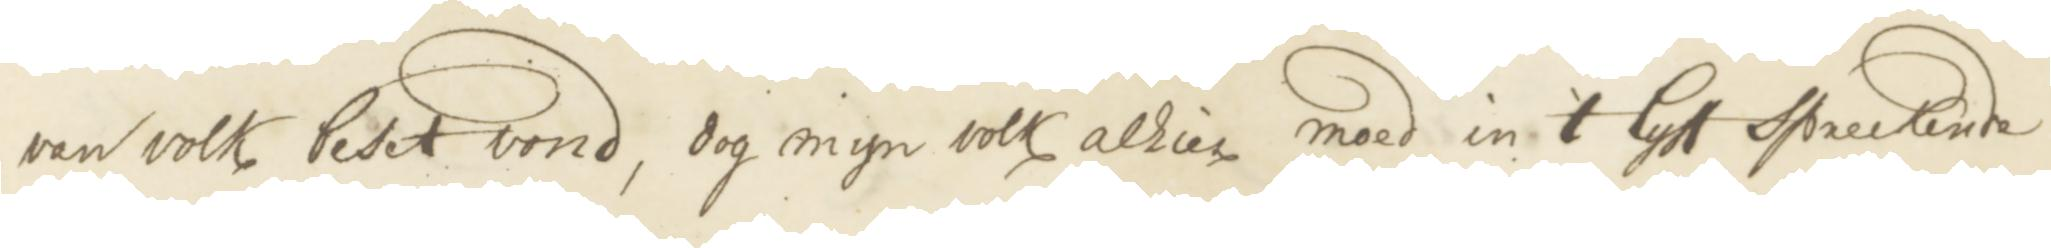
van volk beset vond, dog myn volk alhier moed in ’t lyff spreekende
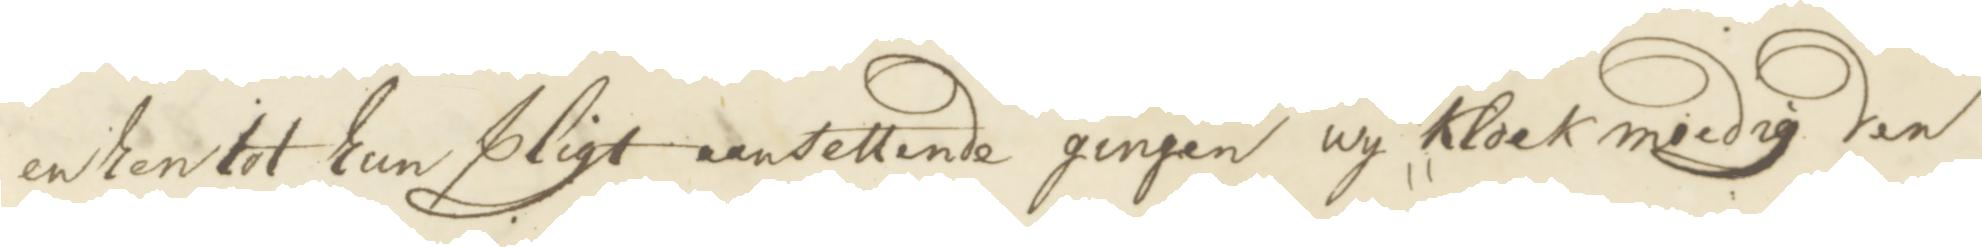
en hen tot hun pligt aansettende gingen wy „„ kloek moedig den
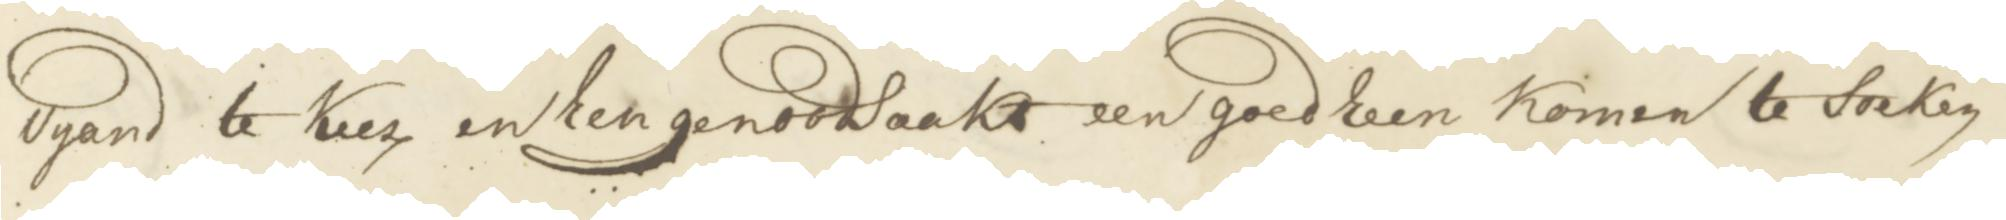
vyand te kies en hen genoodsaakt een goed heen komen te soeken
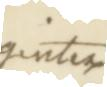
ginter
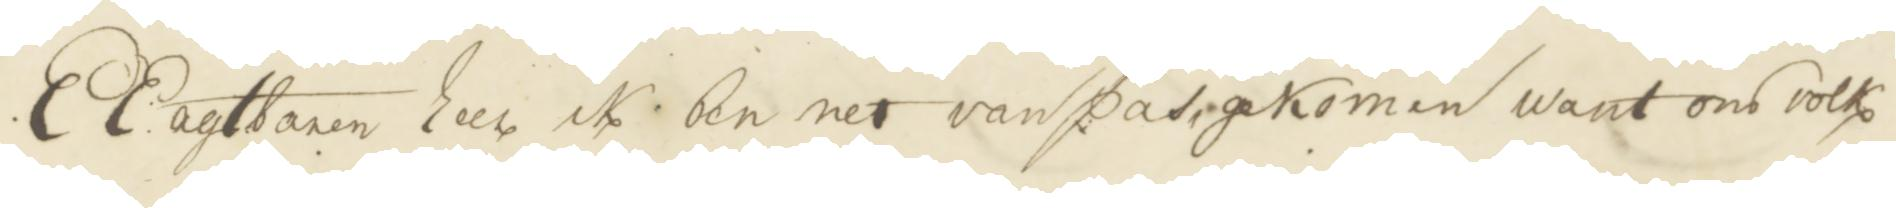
E E: agtbaren heer ik ben net van pas ^ gekomen want ons volk
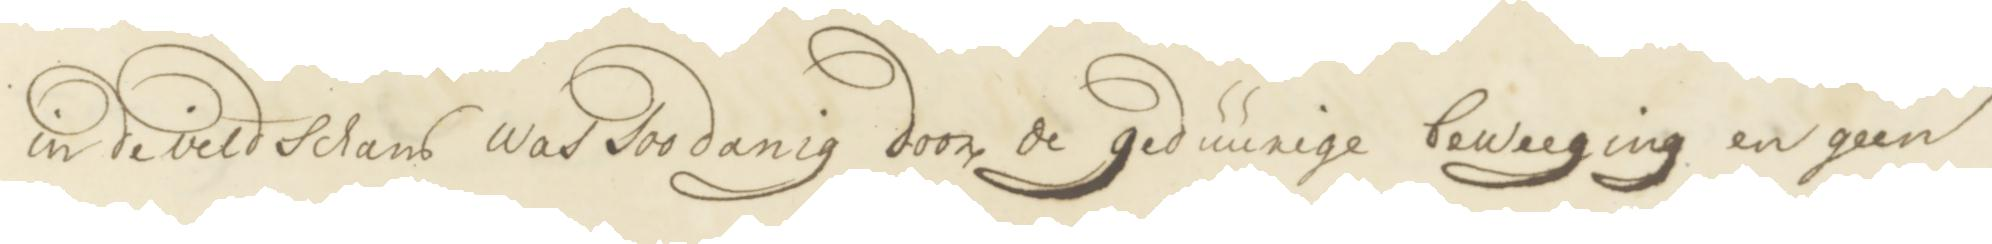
in de veldschans was soodanig door de geduurige beweeging en geen
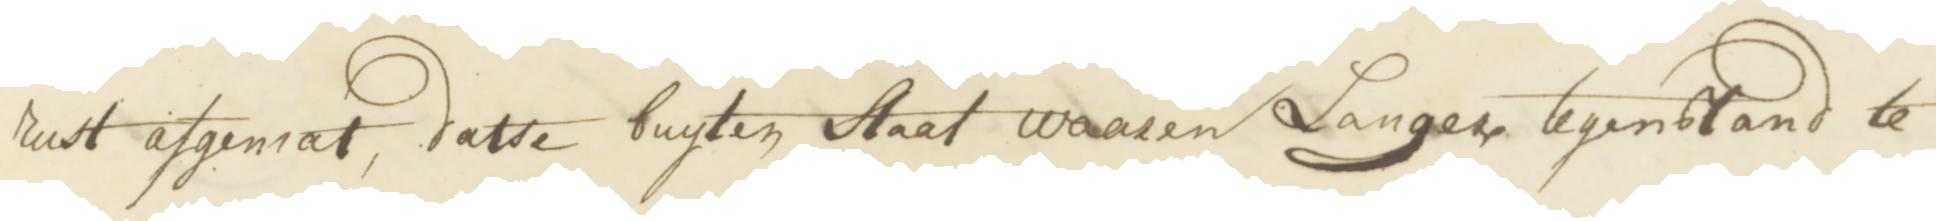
rust afgemat, datse buyten staat waaren Langer tegenstand te
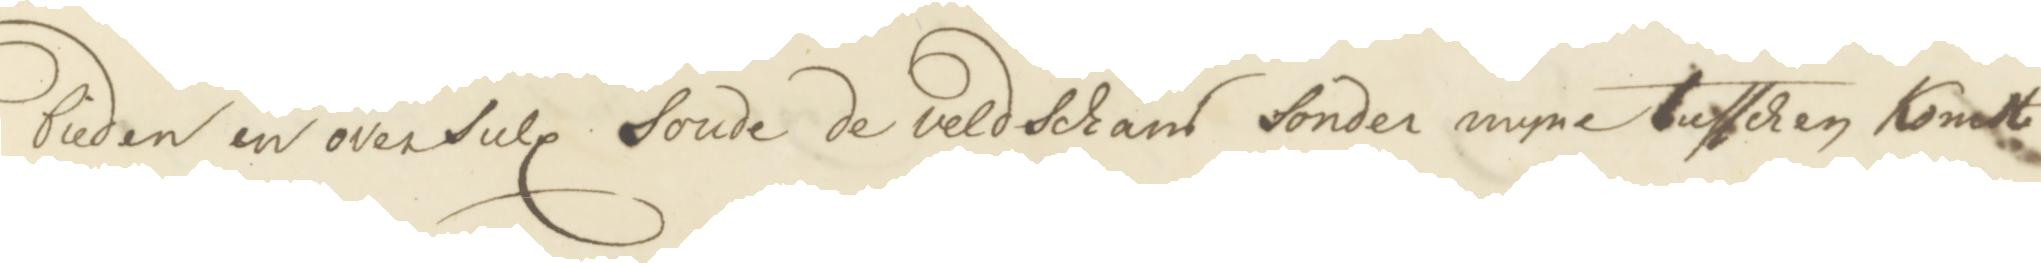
bieden en oversulx soude de veldschans sonder myne tusschen komst
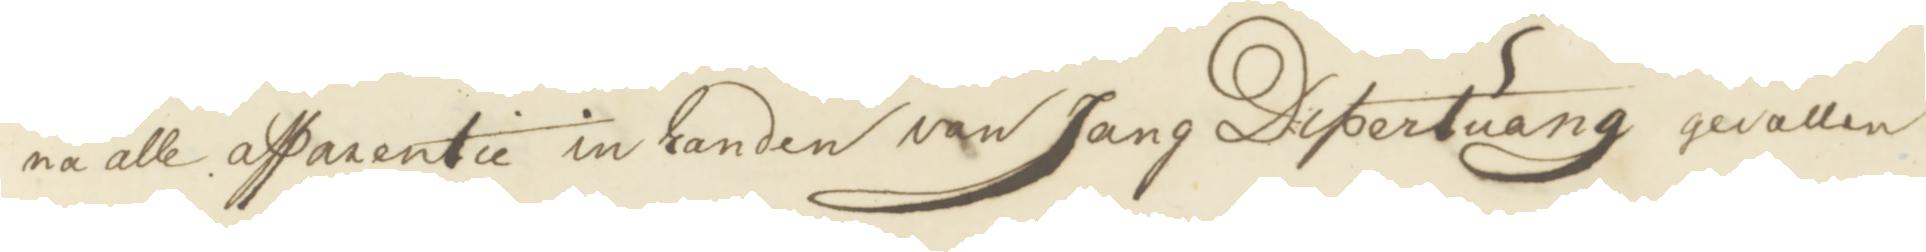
na alle apparentie in handen van Jang Dipertuang gevallen
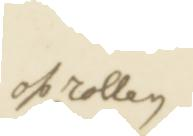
op rollen
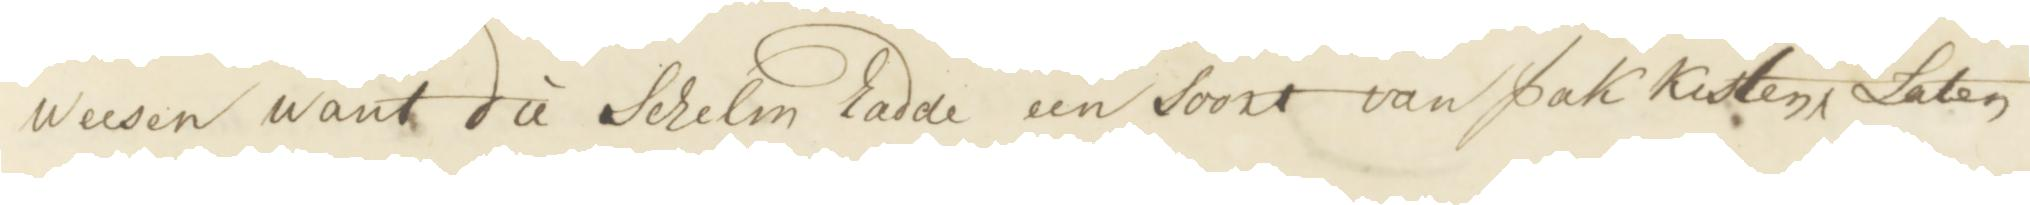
weesen want die schelm hadde een soort van pak kisten ^ Laten
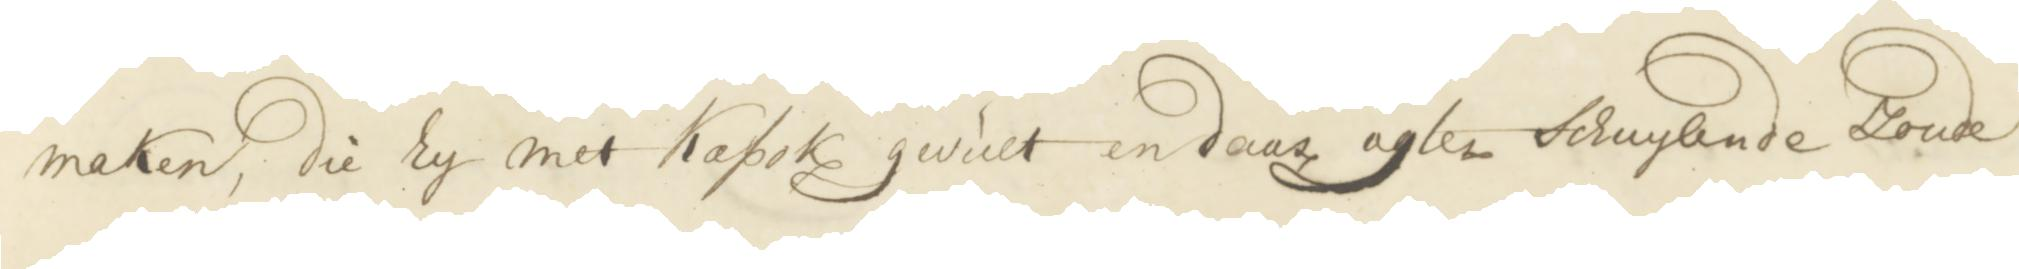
maken, die hy met Kapok gevult en daar agter schuylende zoude
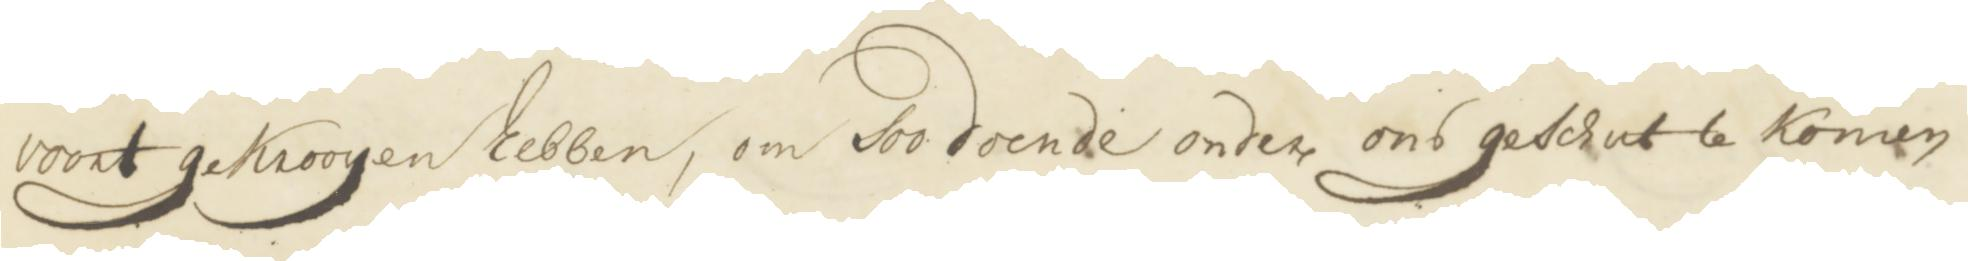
voort gekrooyen hebben, om soo doende onder ons geschut te komen
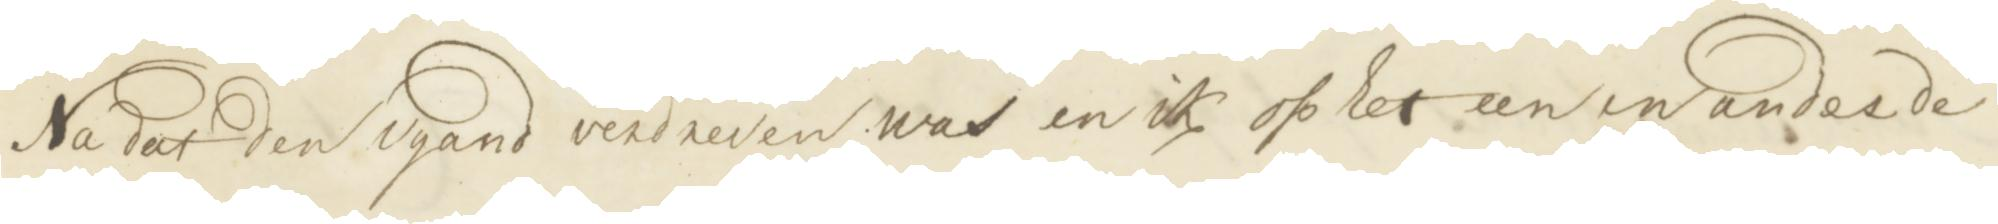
Na dat den vyand verdreven was en ik op het een en ander de
